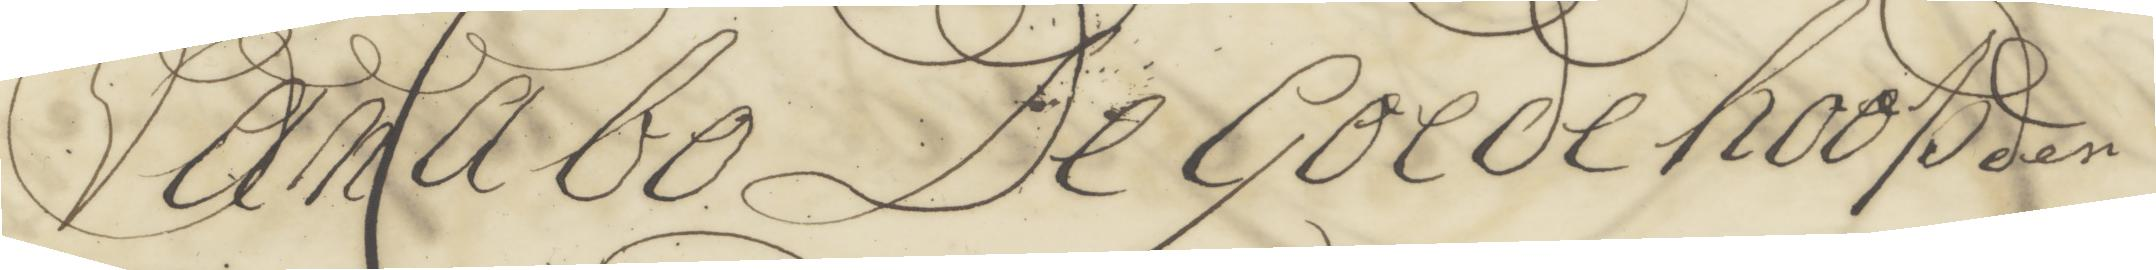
Van Cabo De Goede hoop den
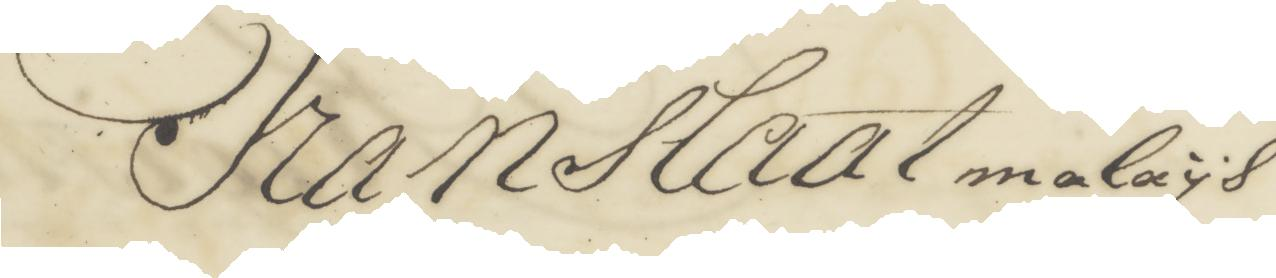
Translaat malaijs
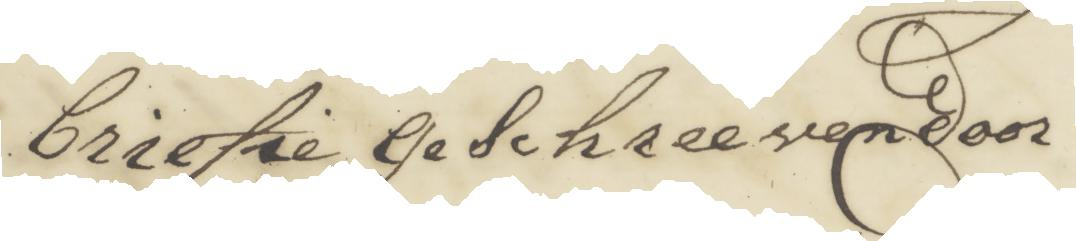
briefie geschreeven door
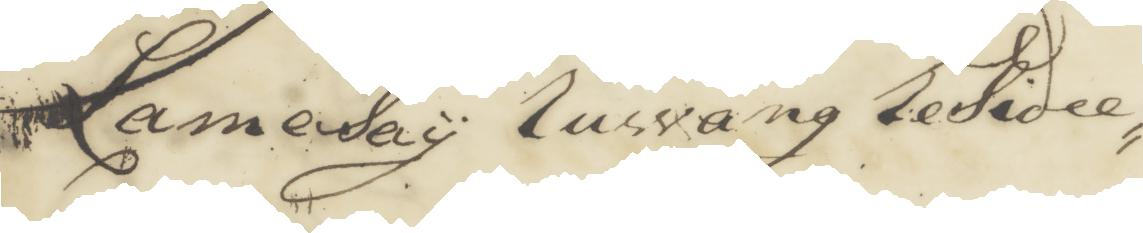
Lamesaij ruwang residee
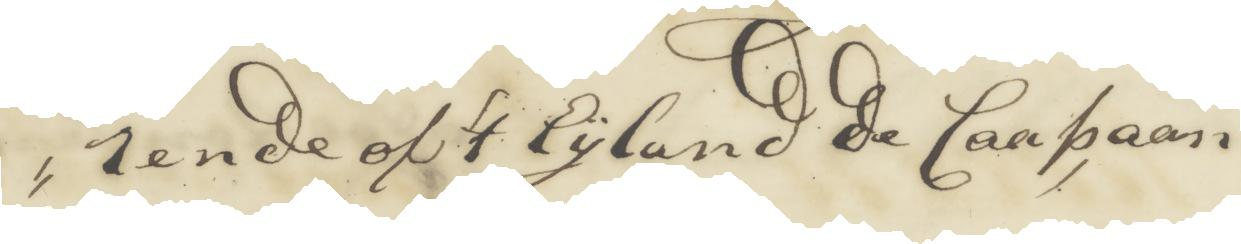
„rende op 't Eijland de Caap aan
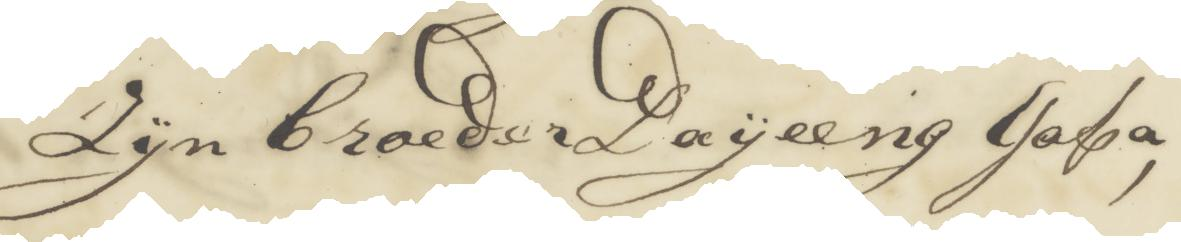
zijn broeder Daijeeng Gapa,
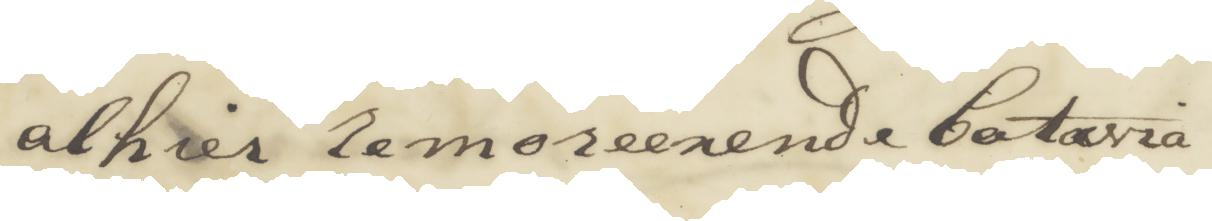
alhier remoreerende batavia
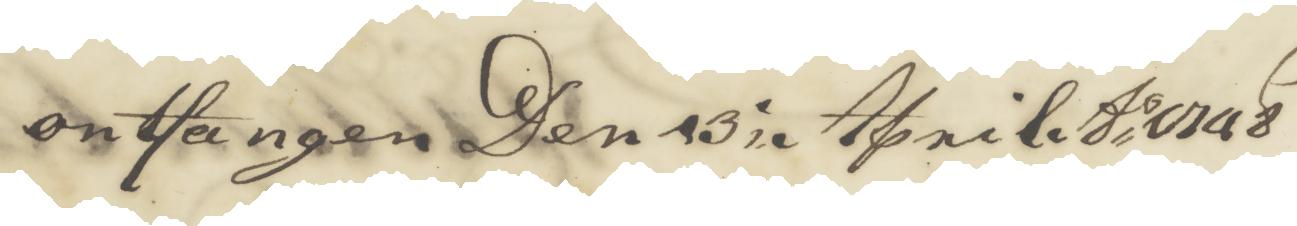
ontfangen Den 13„e April A„o 1748
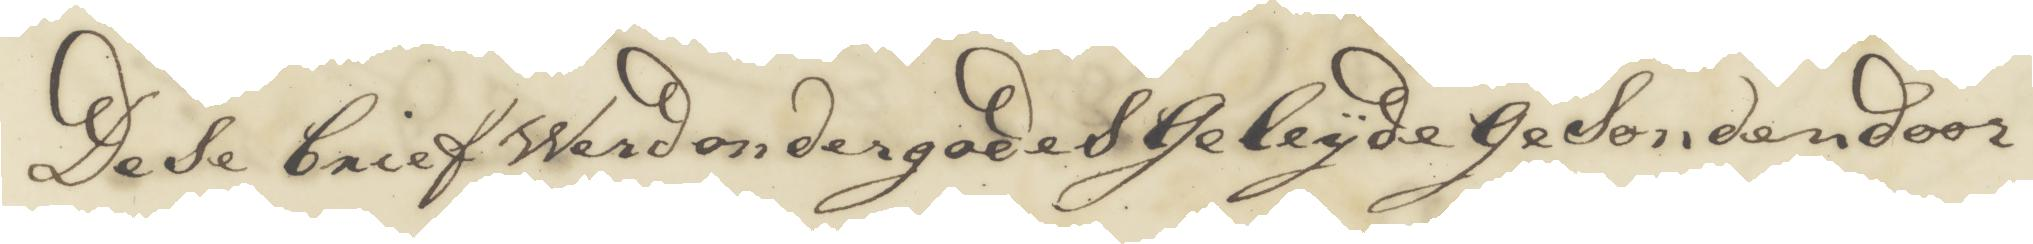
Dese brief werd onder godes geleijde gesonden door
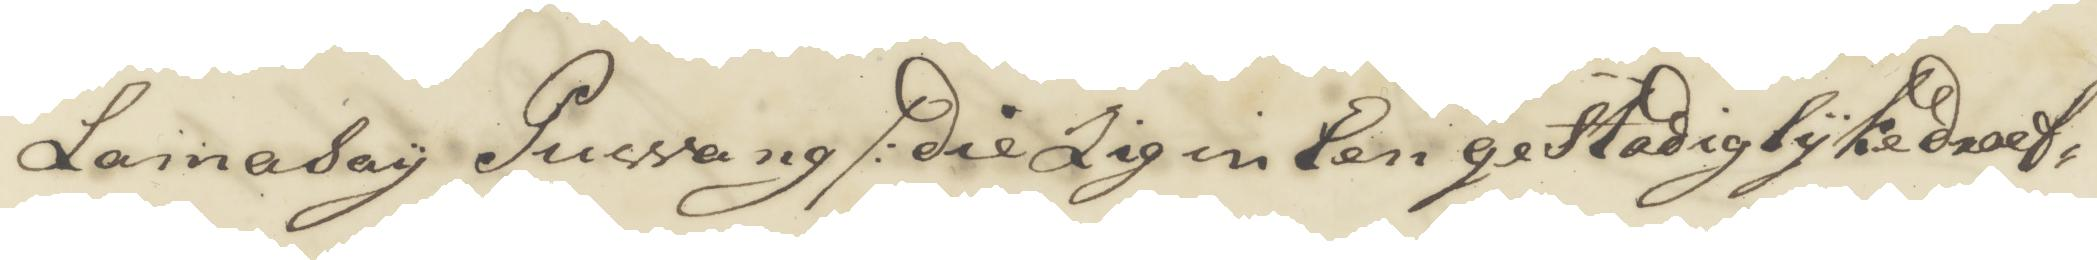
Lamasaij Puwang /: die zig in Een gestadiglijke droef„
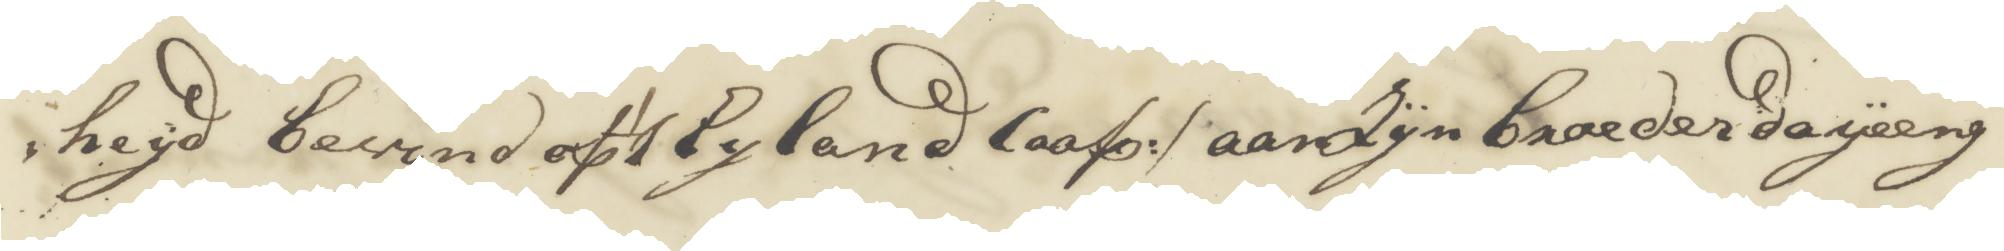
„heijd bevind op’t Eyland Coop :/ aan zijn broeder daijeeng
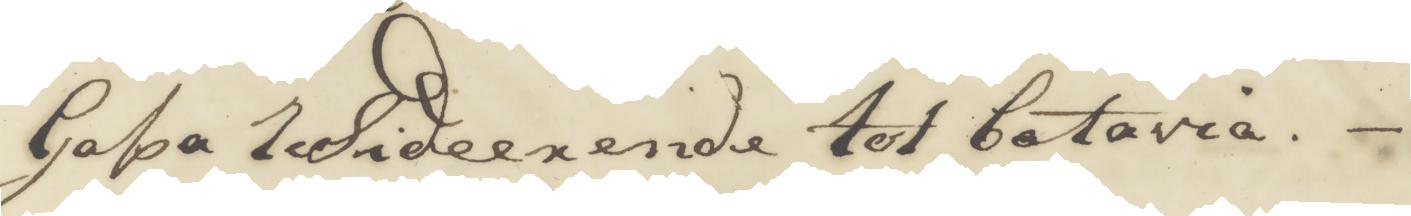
Gapa resideerende tot batavia. —
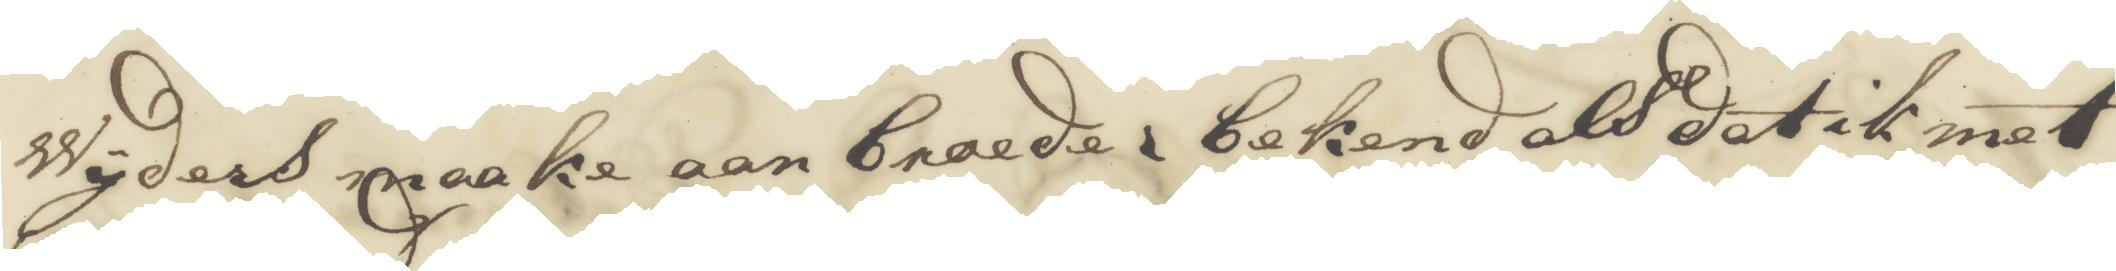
Wijders maake aan broeder bekend als dat ik met
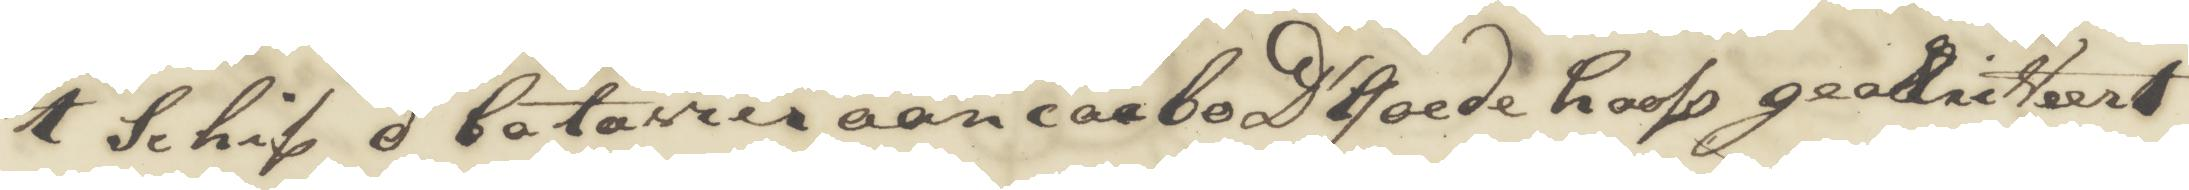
’t schip d' batavier aan caabo D'goede hoop geariveert
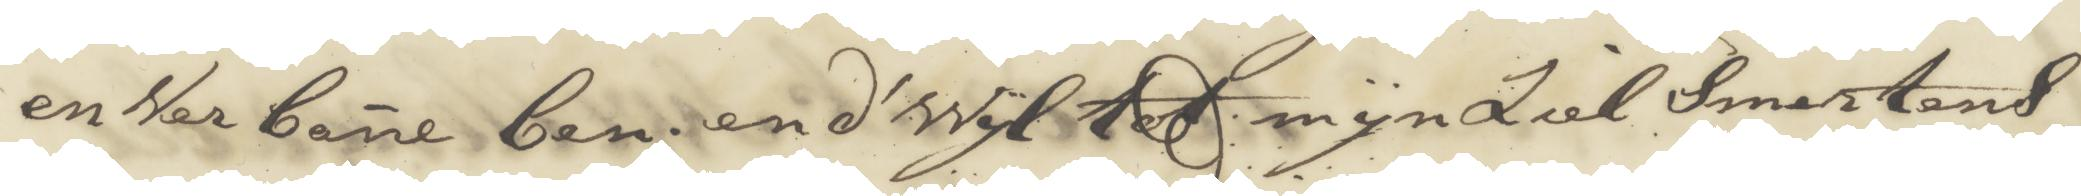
en ver boue ben. en d’wijl tot mijn ziel smertens
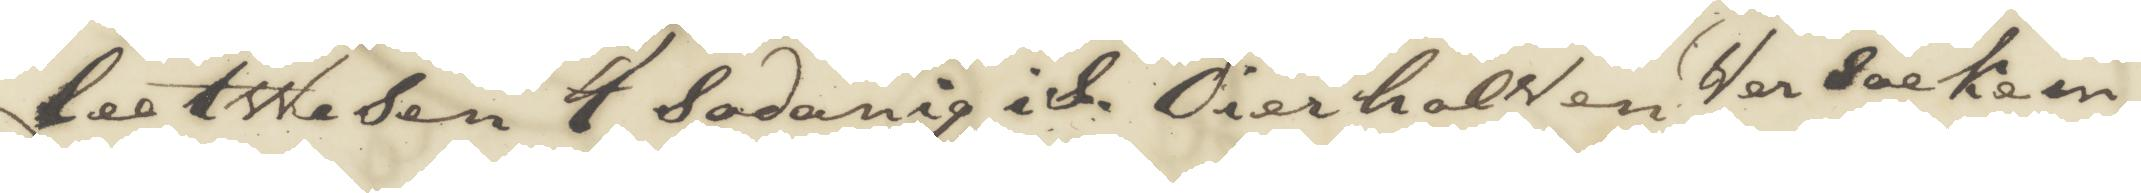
leetwesen ’t sodanig is dierhalven versoeke in
